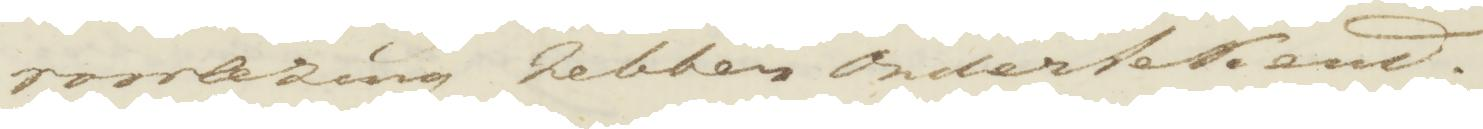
voorlezing hebben ondertekend.
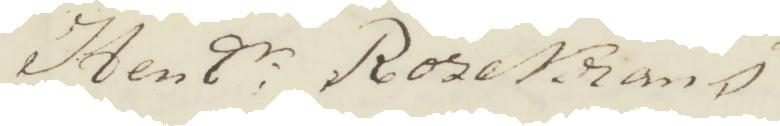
Hend:r Rozekrans
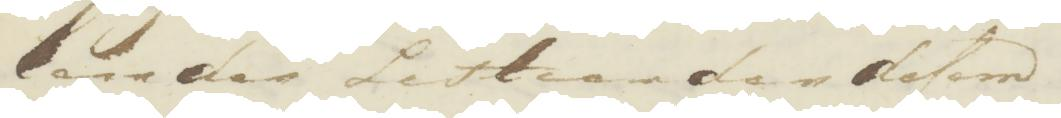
lem den sestienden desem
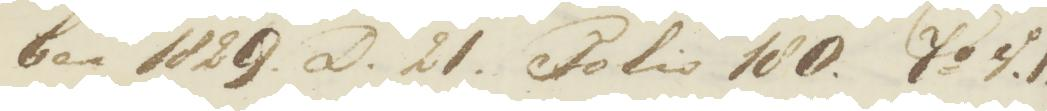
ber 1829. D. 21. Folio 180. N=o c/.o 1.
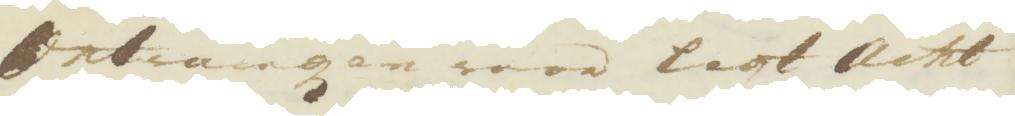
ontvangen voor segt acht
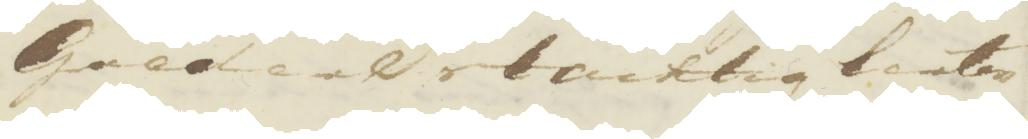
Guldens tachtig centen
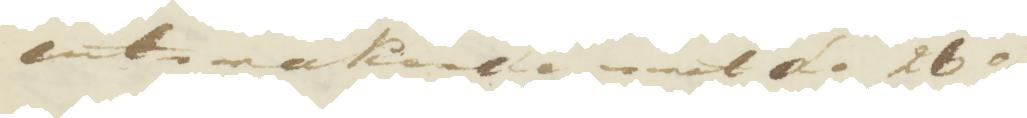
uitmakende met de 26 %
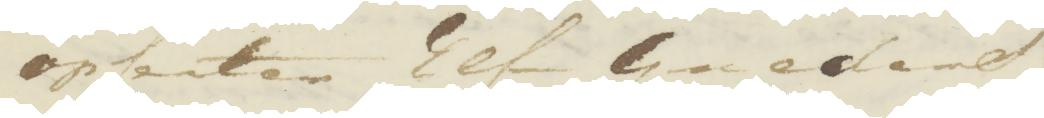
opCenten Elf Guldens
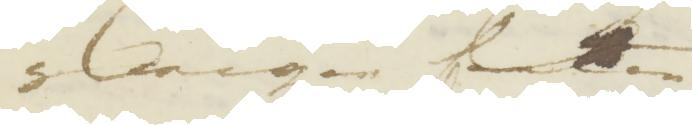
en enigen centen
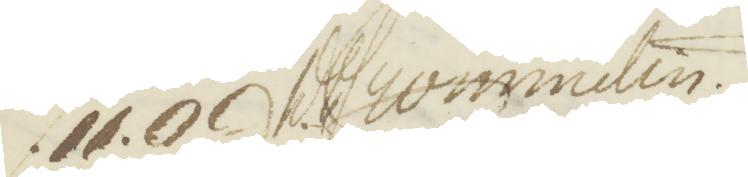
ƒ 11.09 W. E Crommelin.
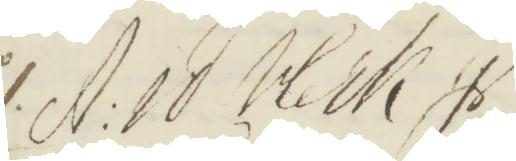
A: 10 Vlerk Jr
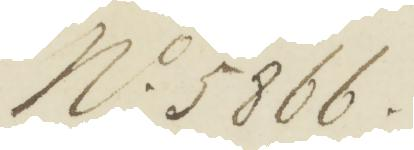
N.o 5866.
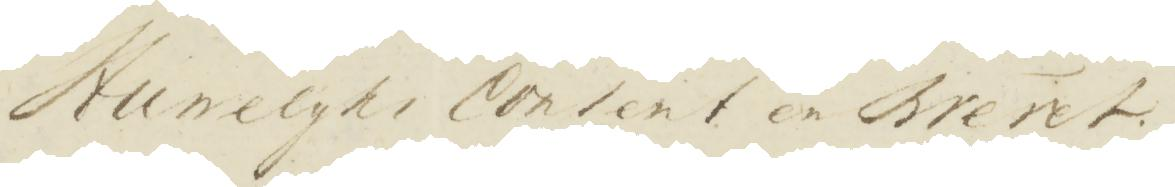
Huwelyks Consent en Brevet.
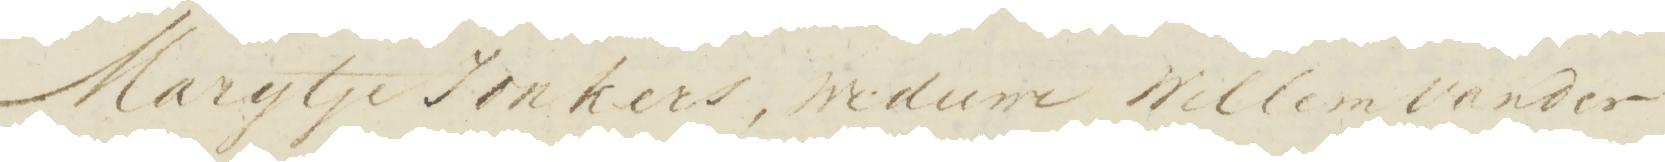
Marytje Jonkers, weduwe Willem van der
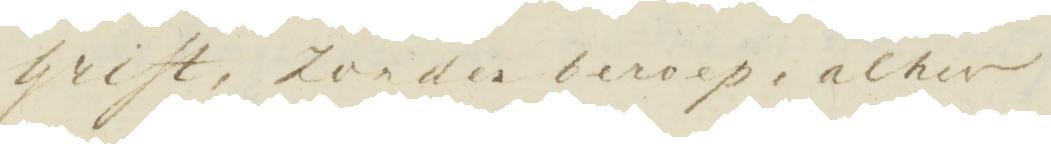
grift, zonder beroep, alhier
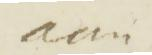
aan
